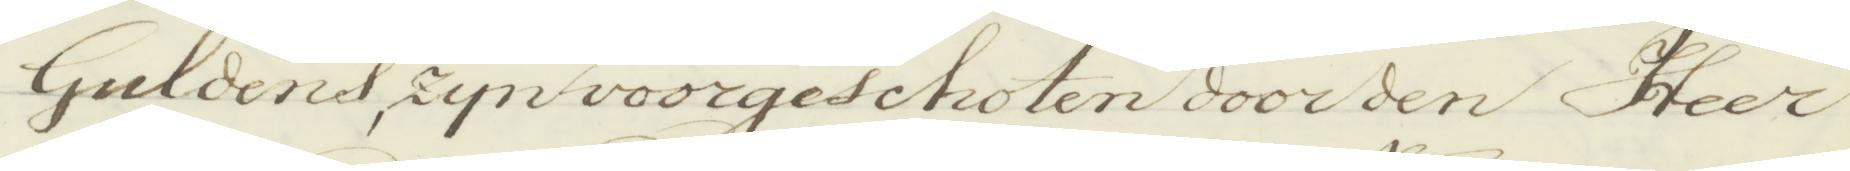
Guldens, zijn voorgeschoten door den Heer
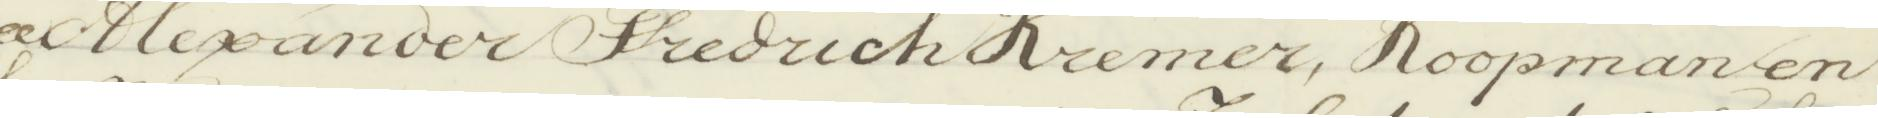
Alexander Fredrich Kremer, Koopman en
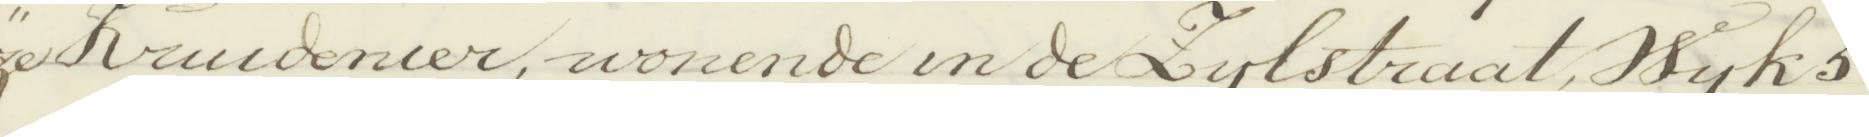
Kruidenier, wonende in de Zylstraat, Wyk 5
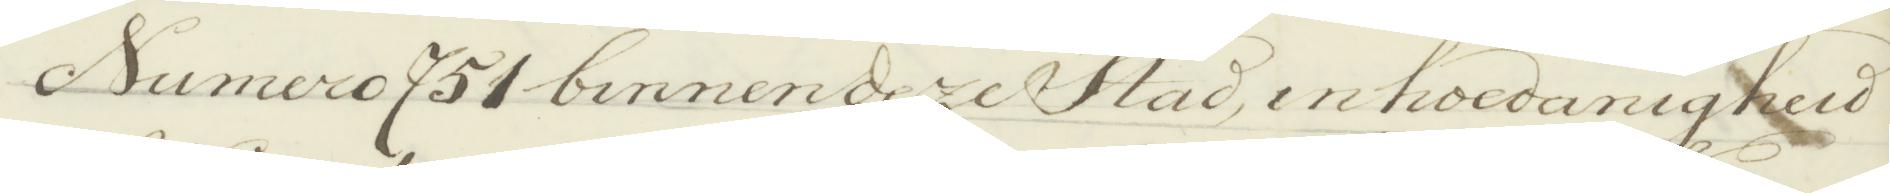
Numero 751 binnen deze Stad, in hoedanigheid
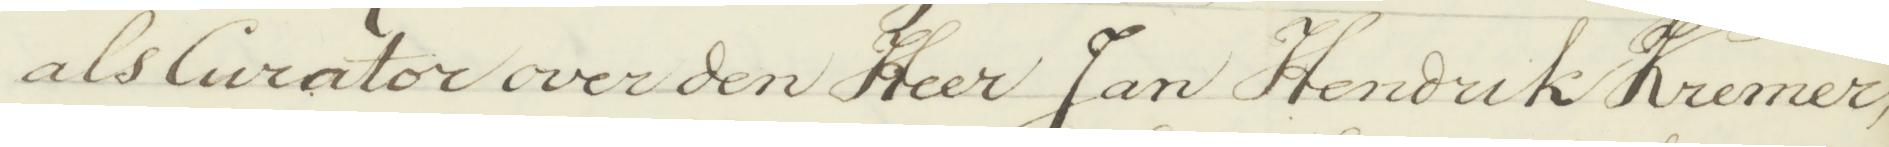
als Curator over den Heer Jan Hendrik Kremer,
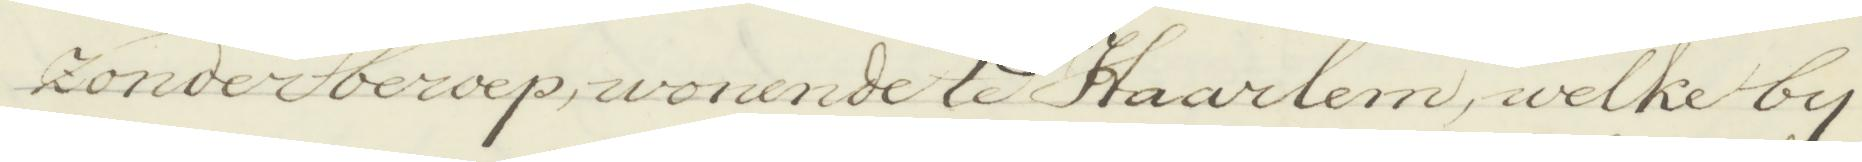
zonder beroep, wonende te Haarlem, welke by
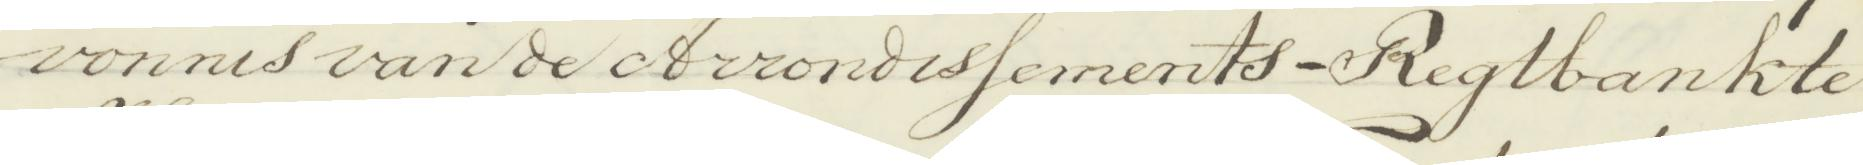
vonnis van de Arrondissements- Regtbank te
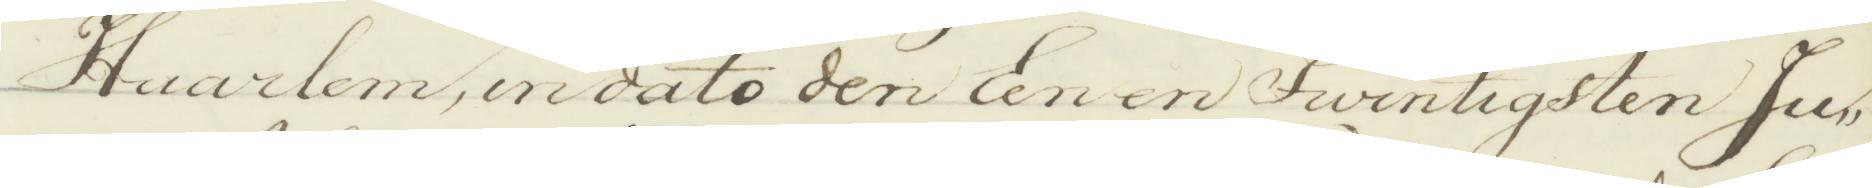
Haarlem, in dato den Een en Twintigsten Ju„
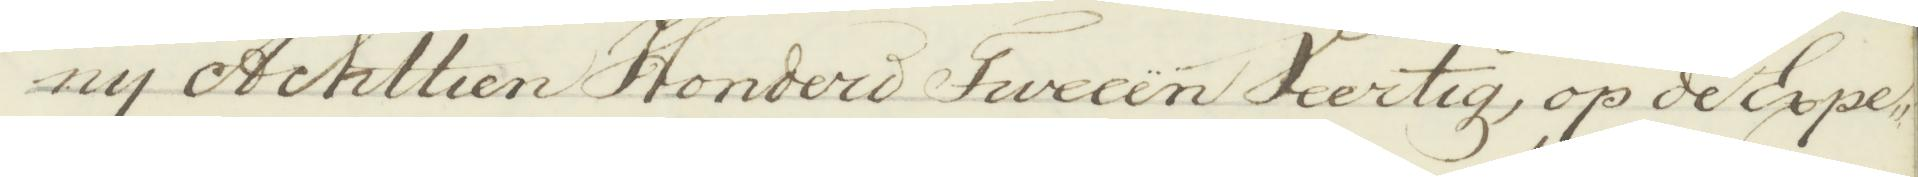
ny Achttien Honderd Tweeën Veertig, op de Expe„
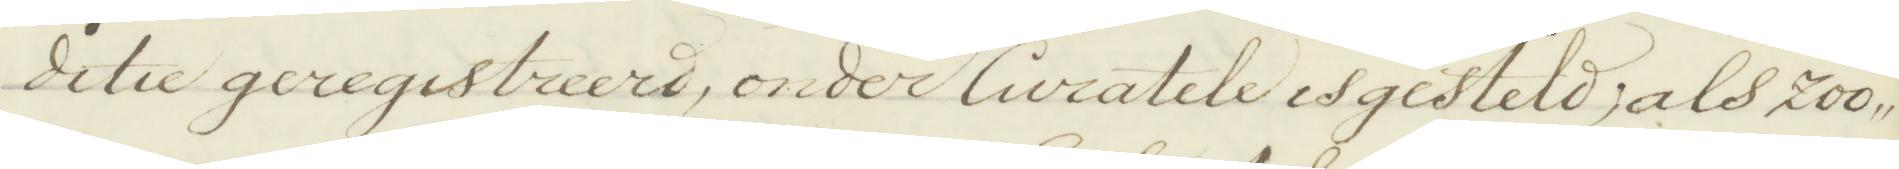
ditie geregistreerd, onder Curatele is gesteld; als zoo,
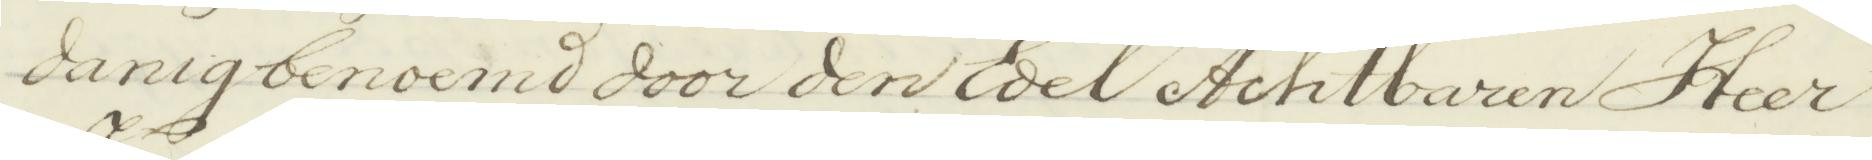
danig benoemd door den Edel Achtbaren Heer
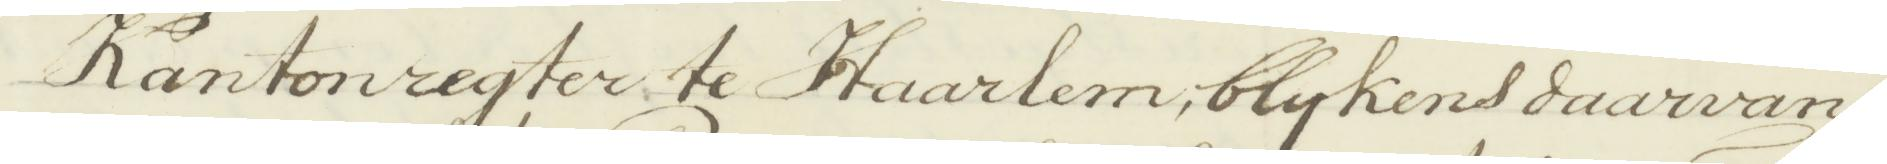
Kantonregter te Haarlem, blykens daarvan
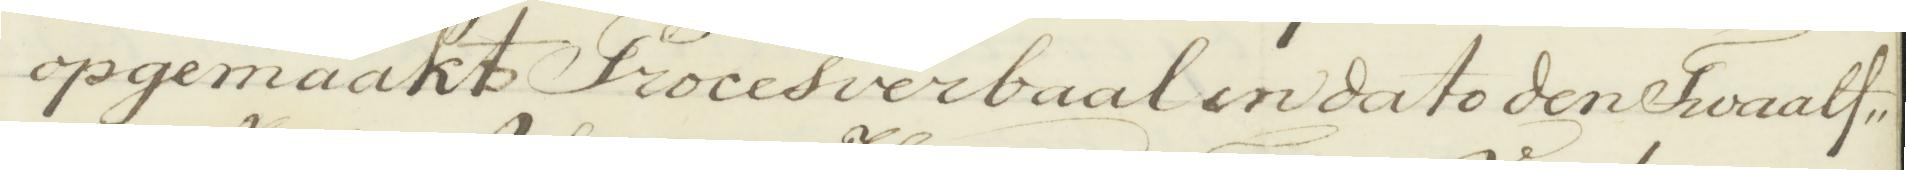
opgemaakt Procesverbaal in dato den Twaalf„
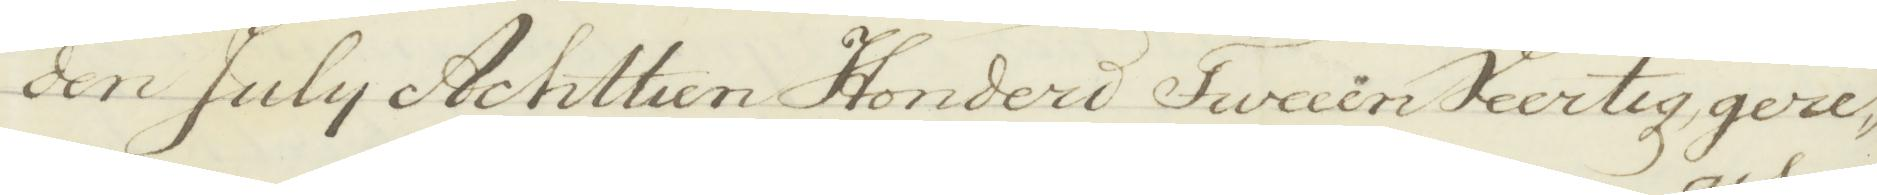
den July Achttien Honderd Tweeën Veertig gere
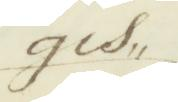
gis„
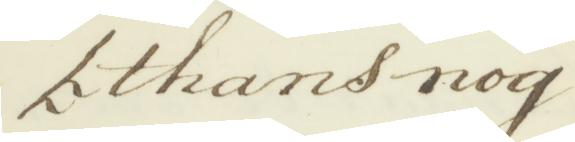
¶ thans nog
